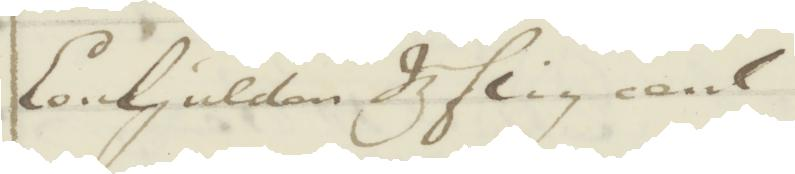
EenGulden Vyftig cent
